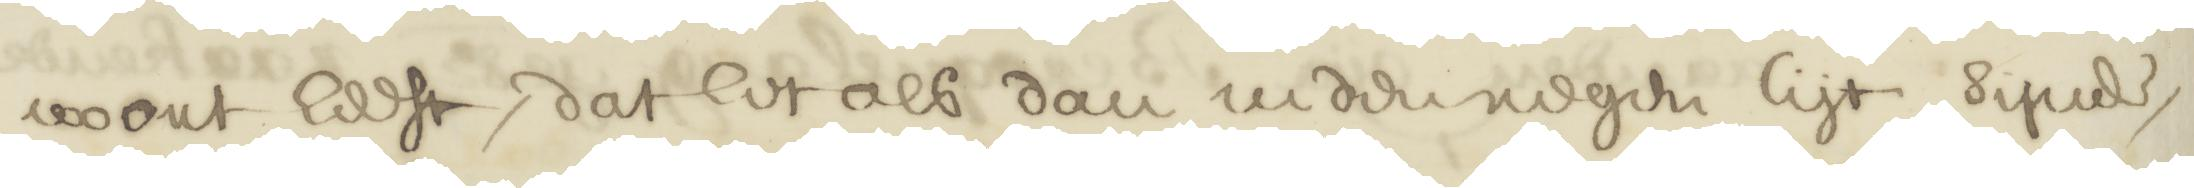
woort heeft, dat het als dan in den negen tijt sijnde,
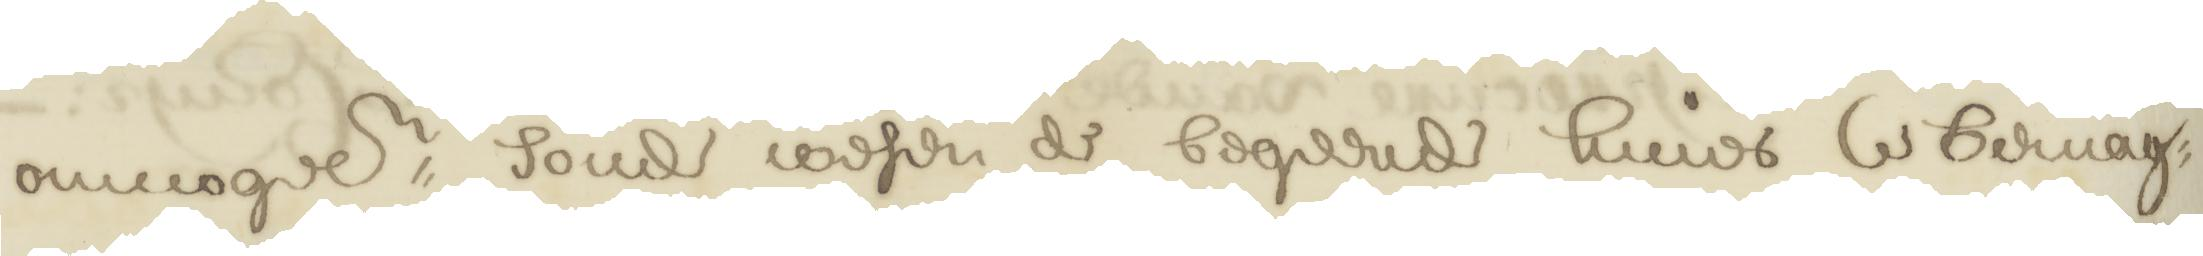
onmogelijk soude wesen de begeerde knies te bemag„
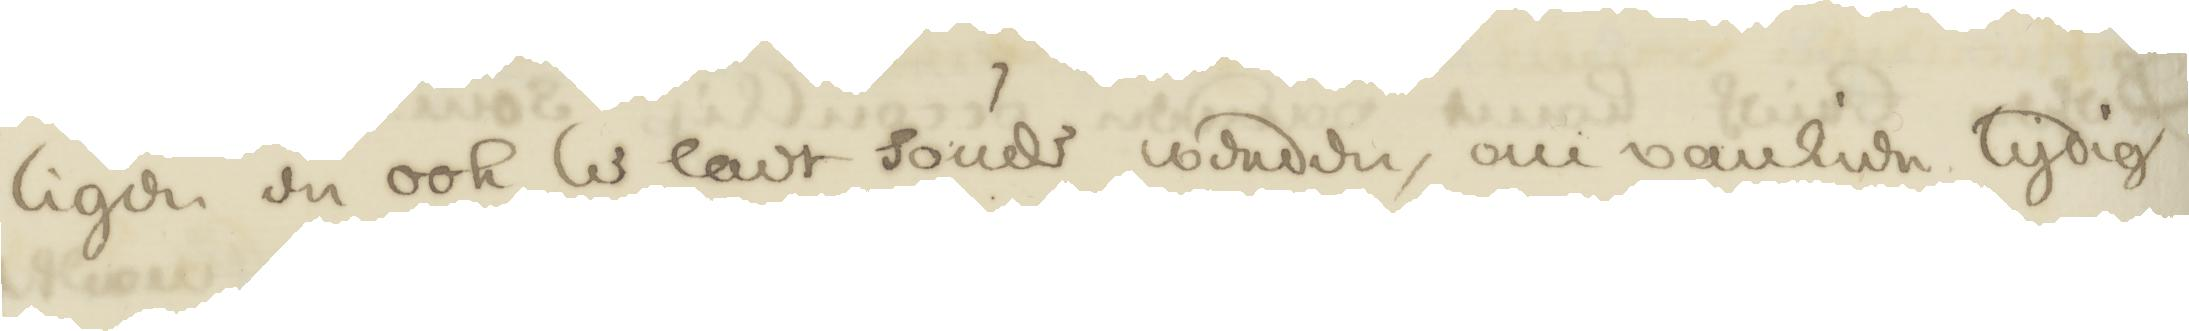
tigen en ook te laet soude werden, om van hier tijdig
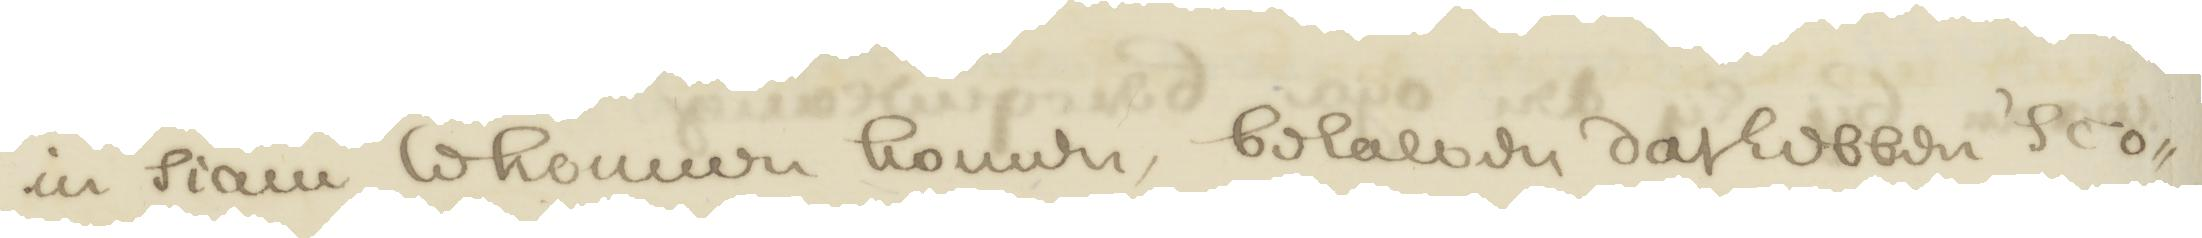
in siam te konnen komen, behalven dat hebben 'sco„
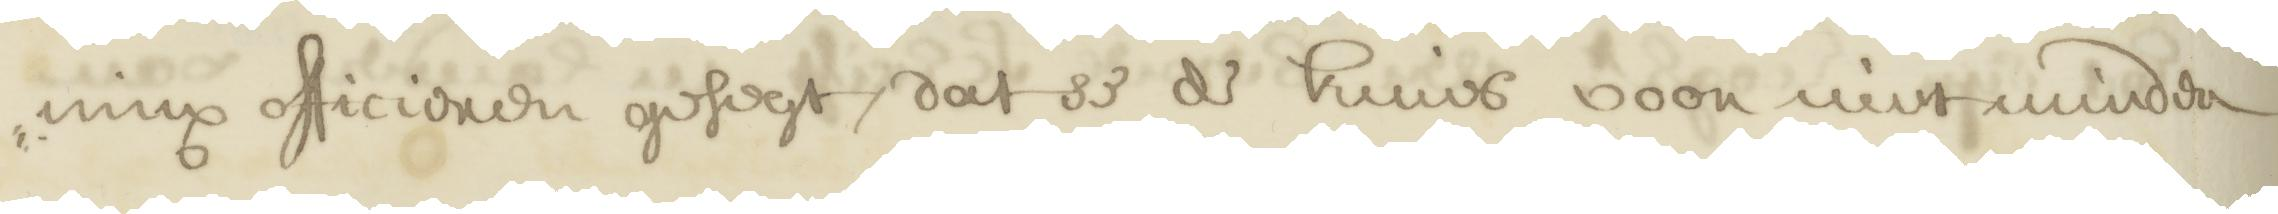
„ninx officieren gesegt, datse de knies voor niet minder
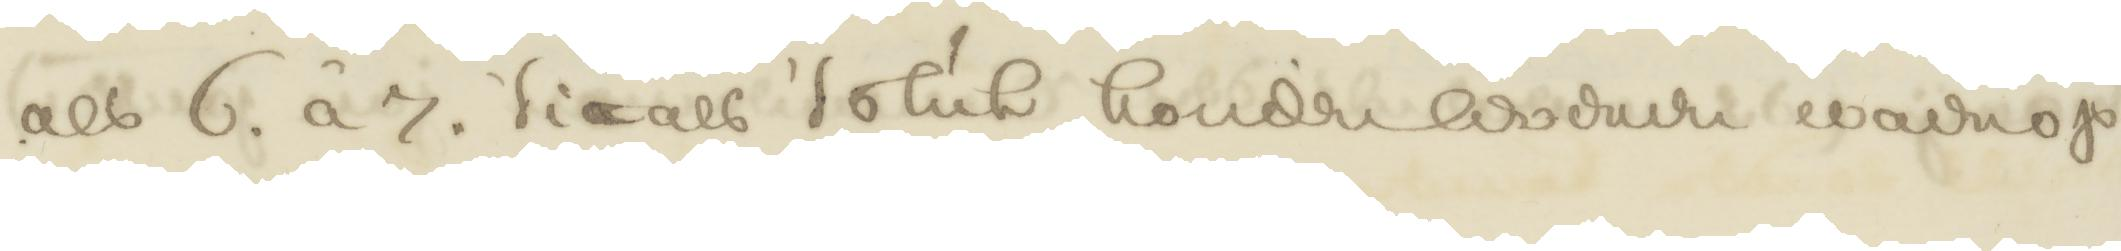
als 6. â 7. 'ticals 'tstuk konden leveren waerop
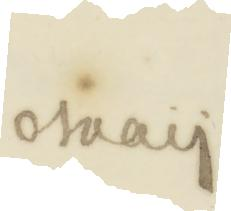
otraij
